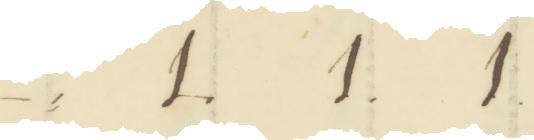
1. 1. 1
